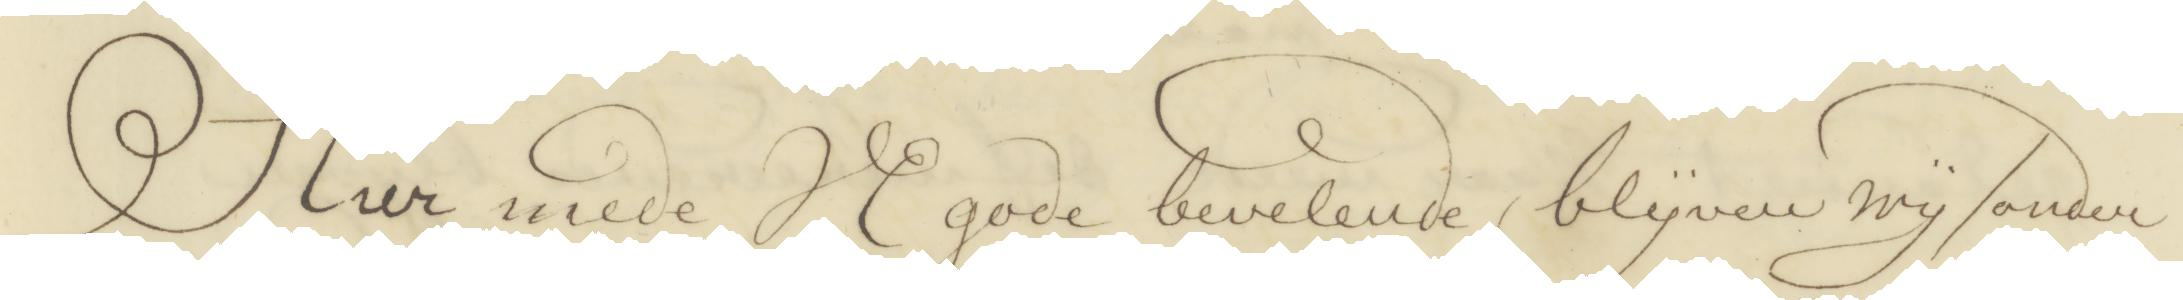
Hier mede VE gode bevelende blijven wij /onder
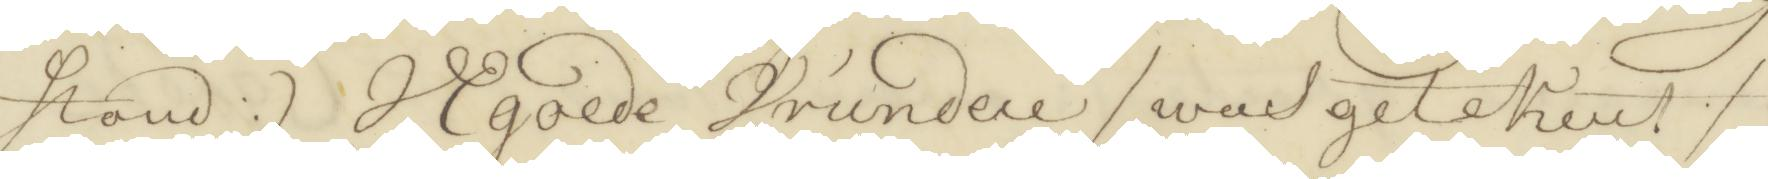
stond:) VEgoede Vrunden /was getekent./ P:
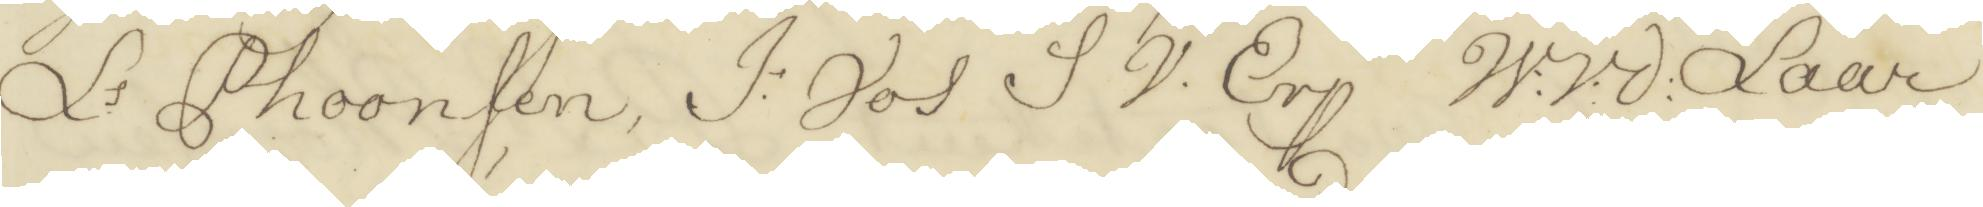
L-s Phoonsen, I: Vos S V. Erp W: v: d: Laar
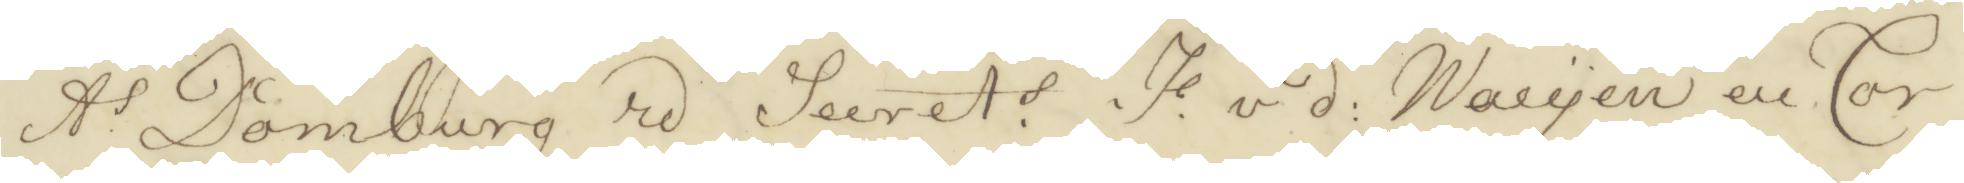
A.s Domburg rd Secret.s J:l v d: Waeijen en Cor
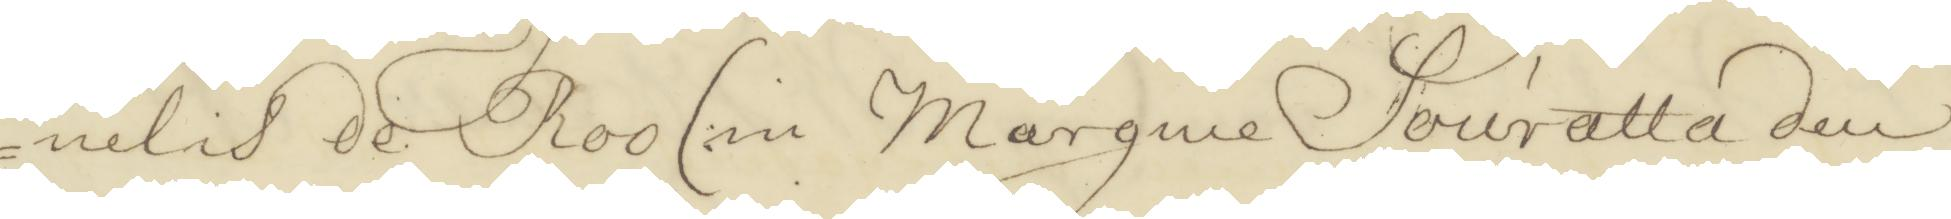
„nelis de Roo (:in Margine Souratta den
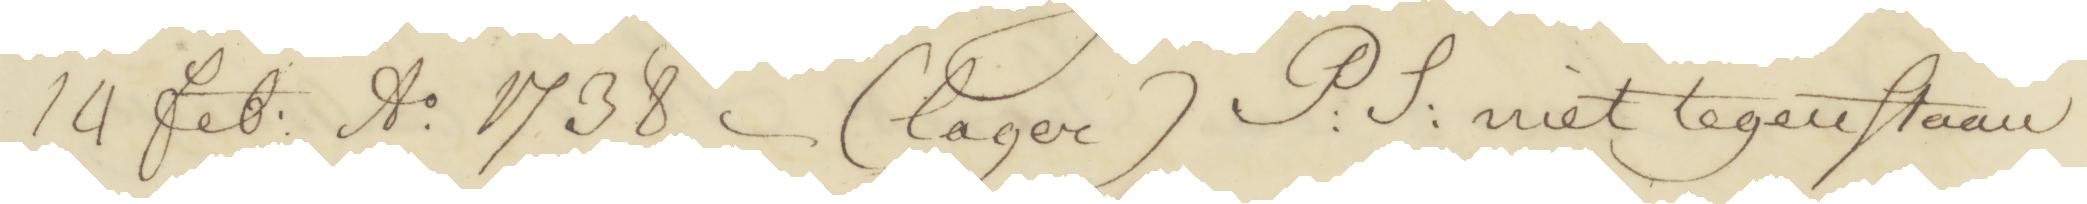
14 feb: A.o 1738 — (lager) P: S: niet tegenstaan
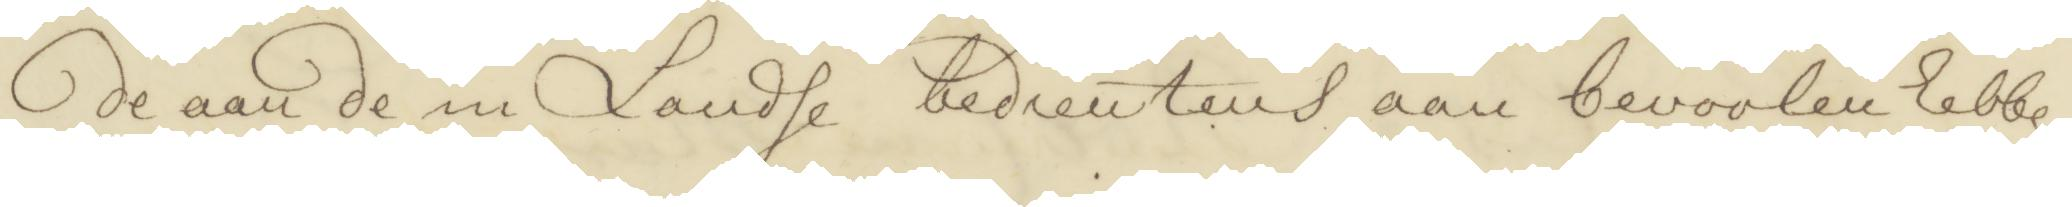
de aan de in Landse bedientens aan bevoolen hebben
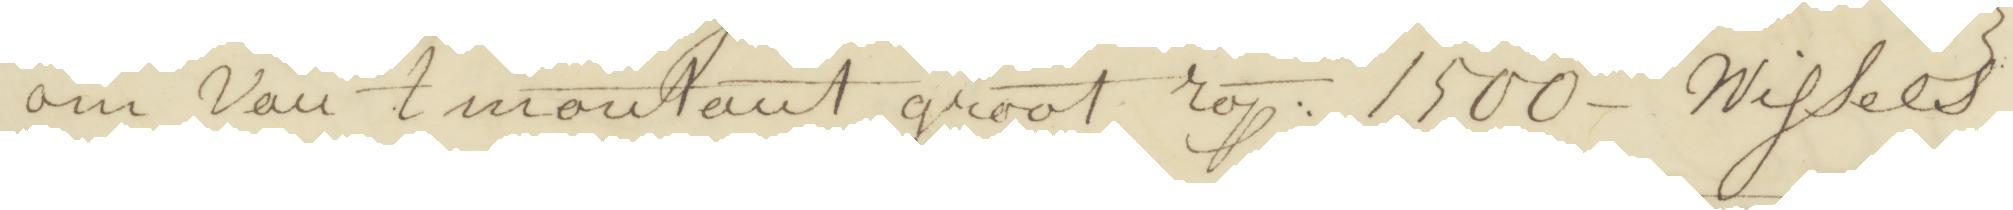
om Van ’t montant groot rop: 1500— Wissels
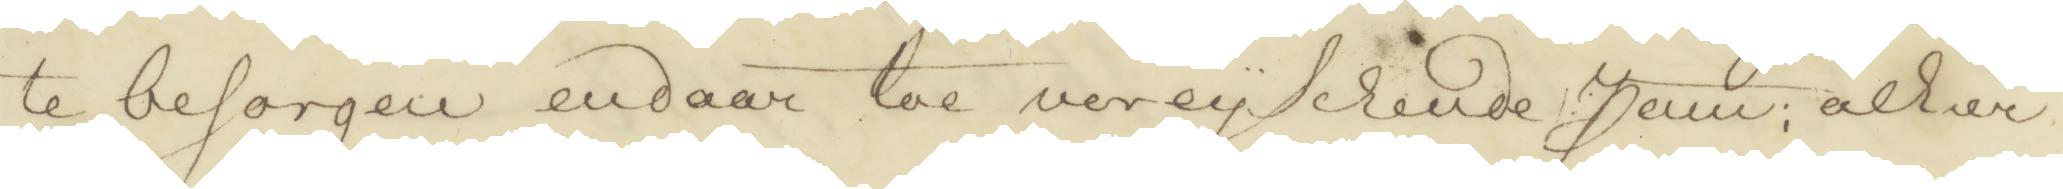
te besorgen endaar toe vereijschende Penn: alhier
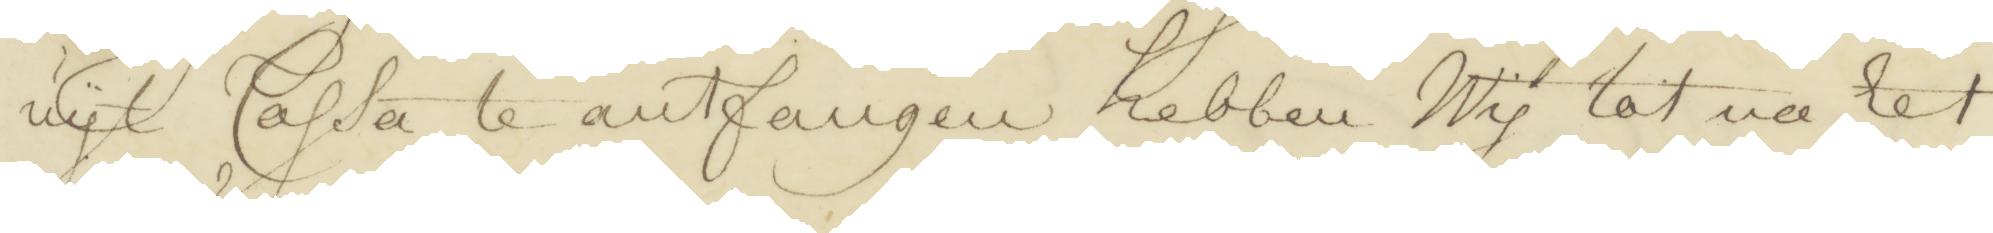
uijt Cassa te ontfangen hebben Wij tot na het
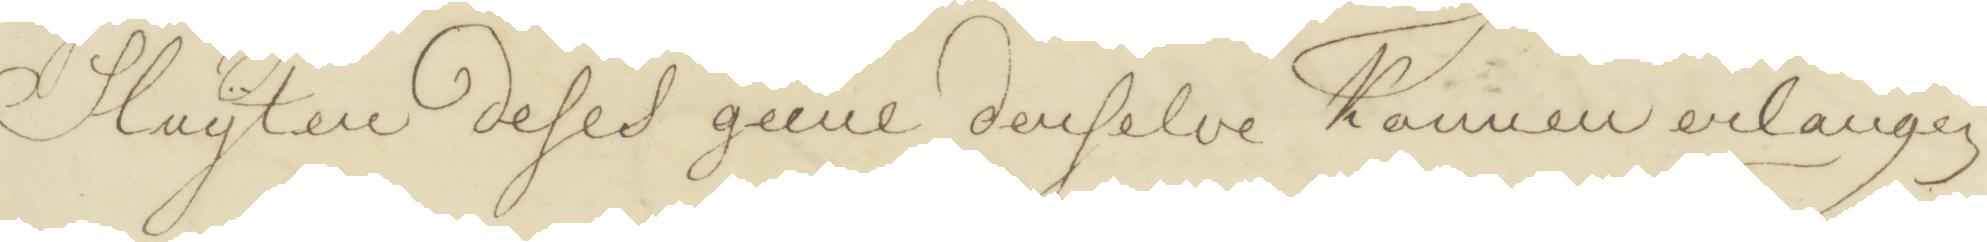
Sluijten deses geene denselve konnen erlangen
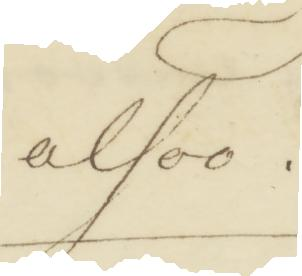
alsoo.
